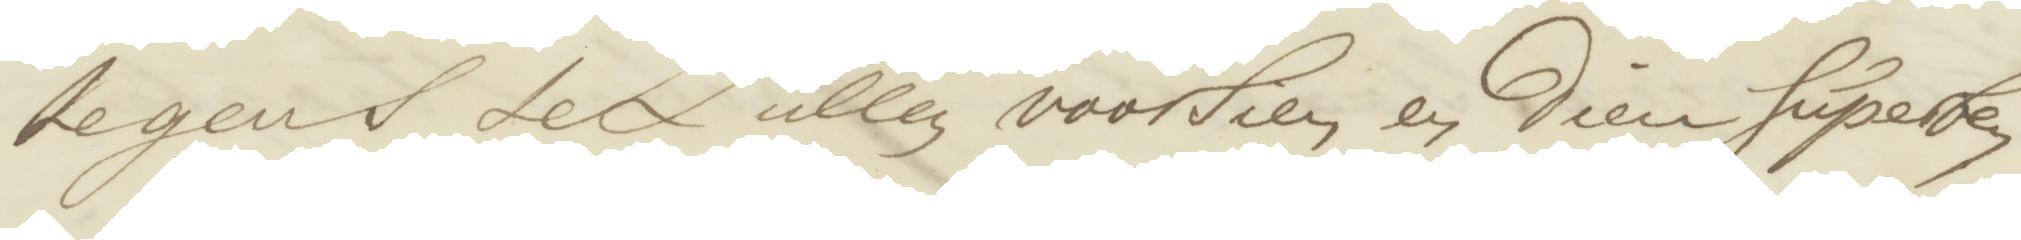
tegens tezullen voorsien en dien superben
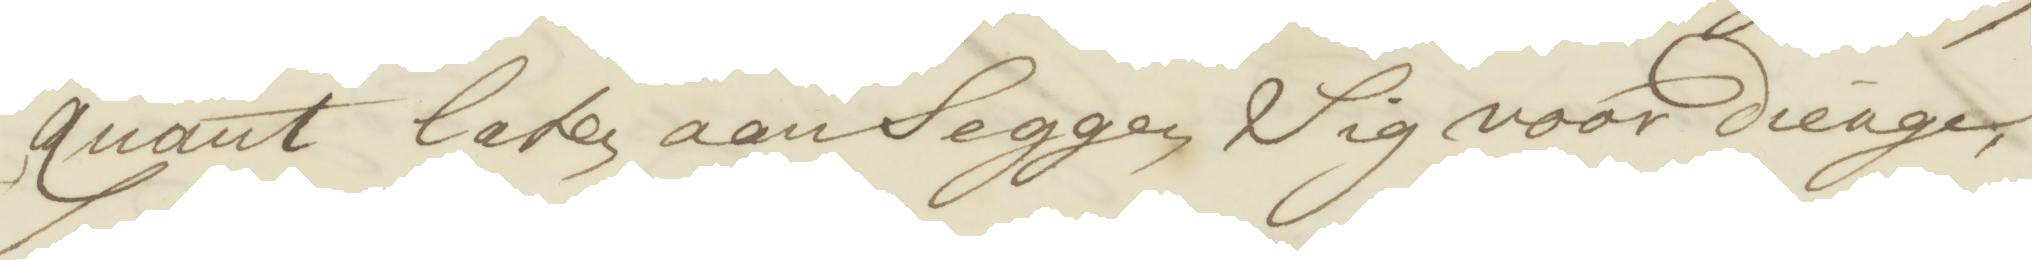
quant laten aanseggen sig voor dierge,
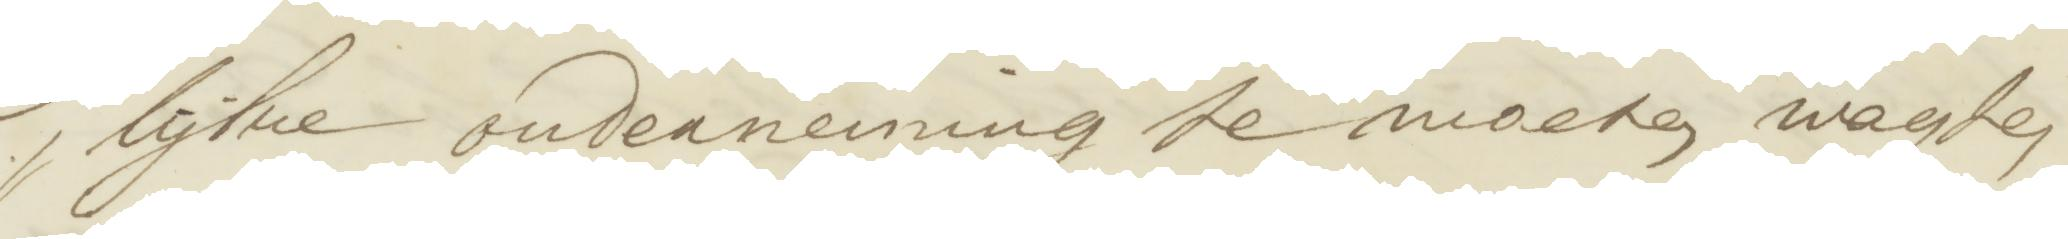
„lijke onderneming te moeten wagten
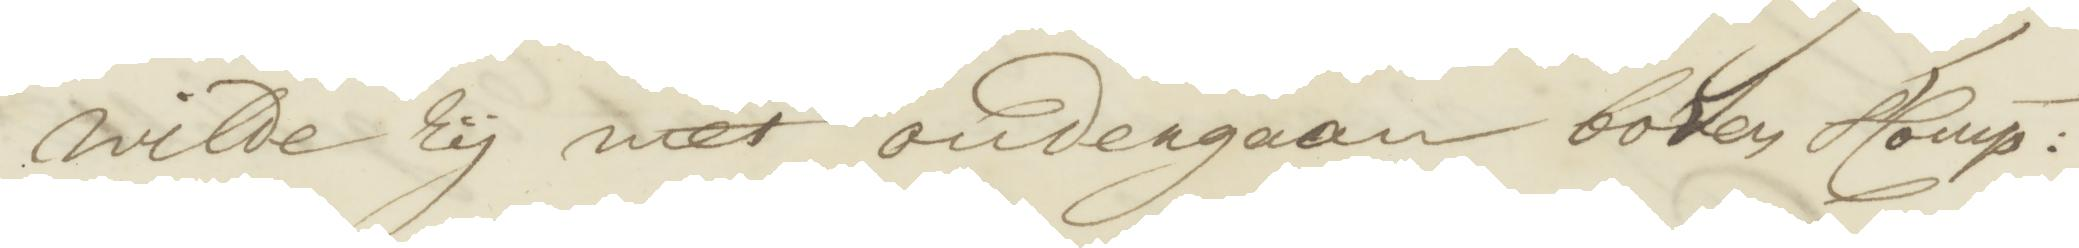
wilde hij niet ondergaan boven 'sComp:s
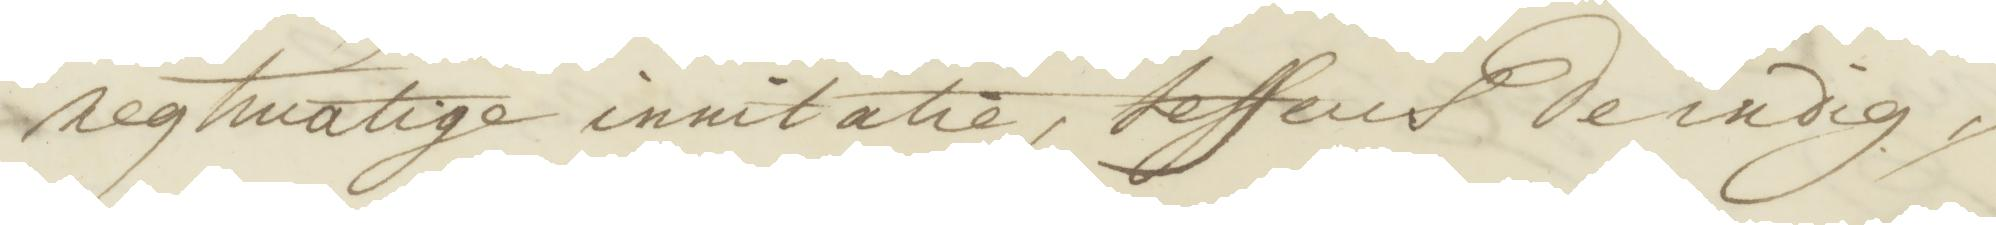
regtmatige innitatie, teffens de indig„
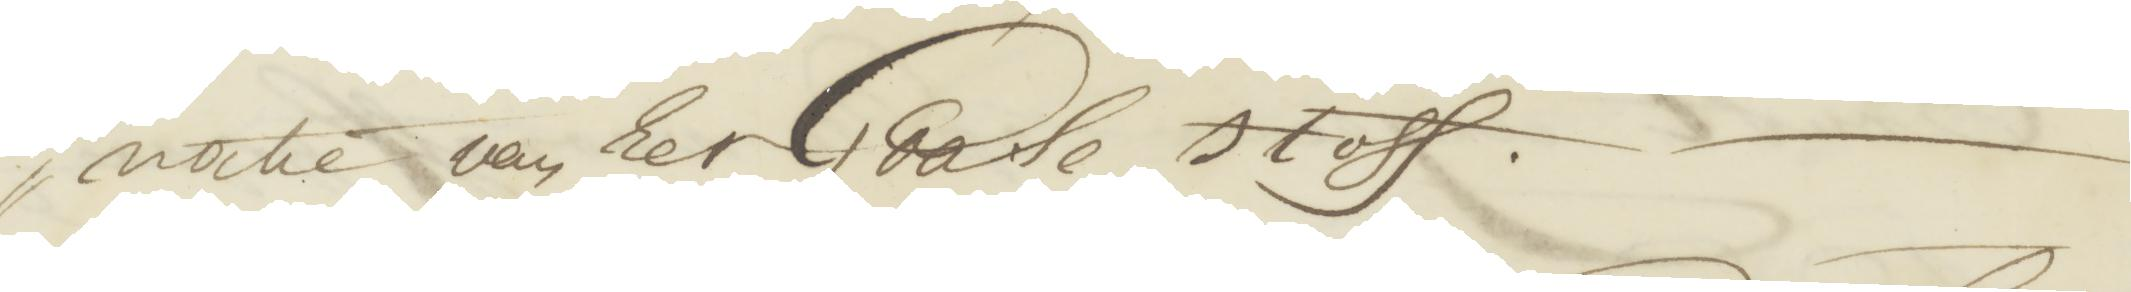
„natie van het Goase stoff. —
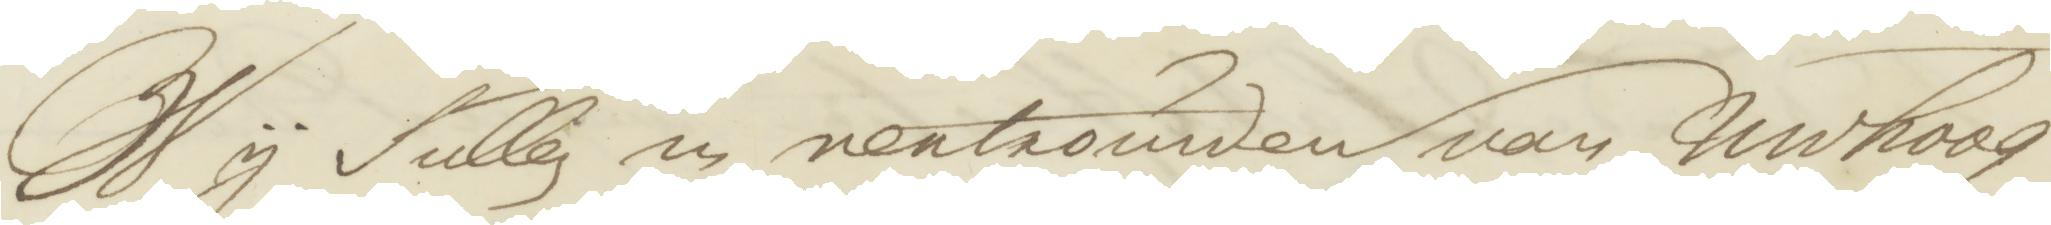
Wij sullen in vertrouwen van uw hoog
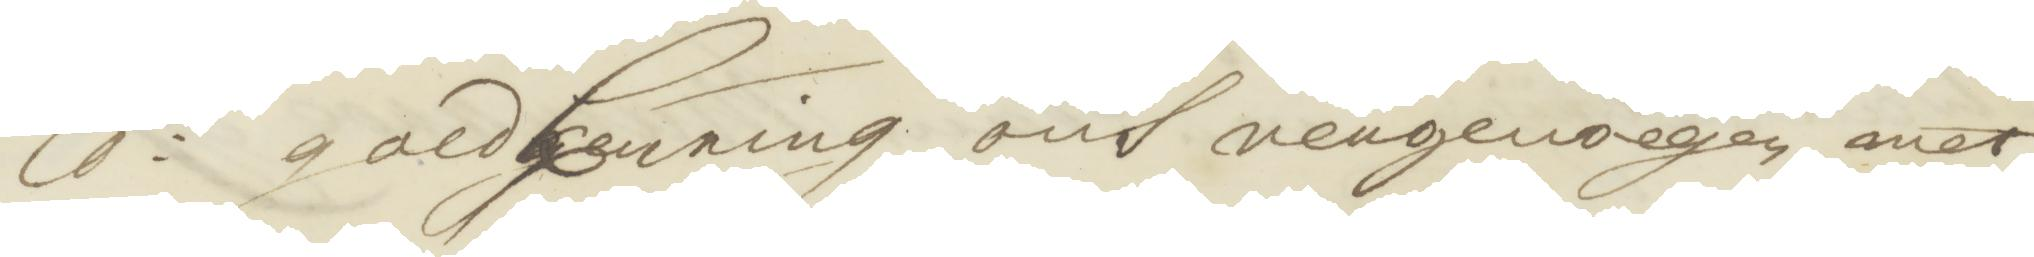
Ed:s goedkeuring ons vergenoegen met
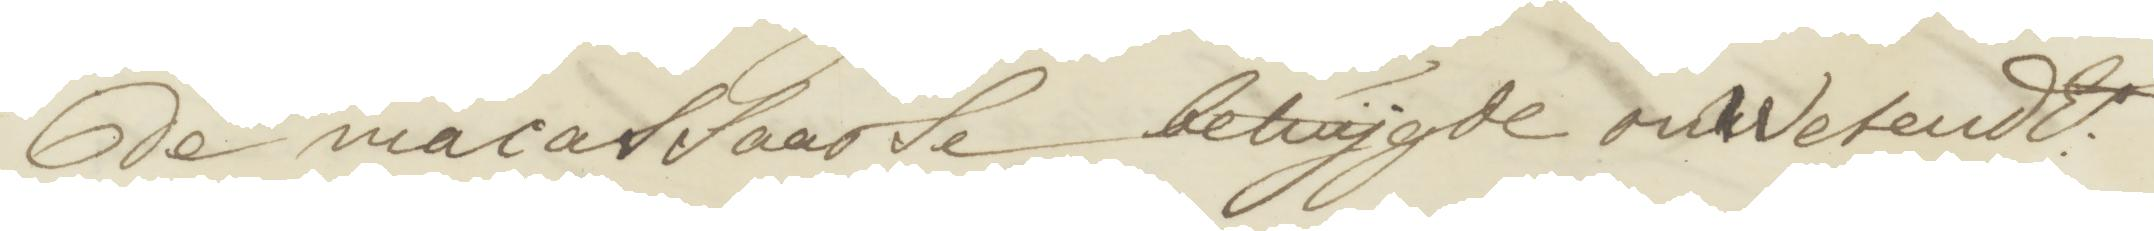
de macassaasse betuijgde onwetendh:t
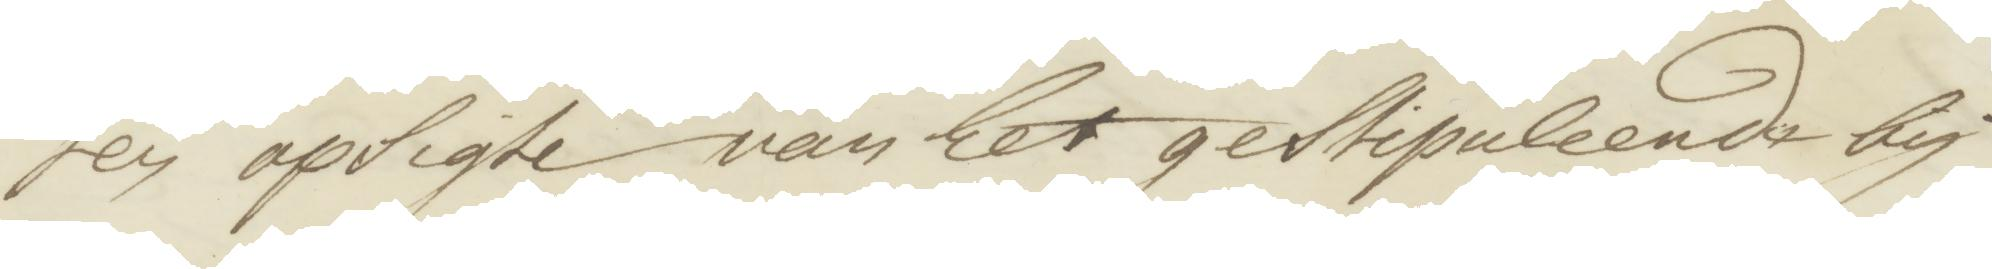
ten opsigte van het gestipuleerde bij
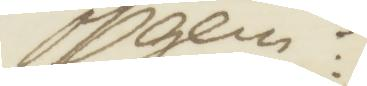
opgem:
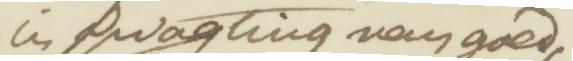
in verwagting van goed„
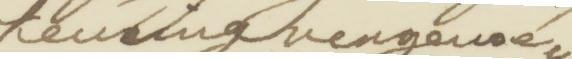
keuring vergenoe„
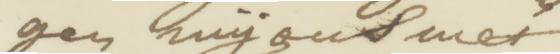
gen wij ons met
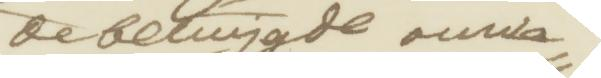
de betuijgde onwe„
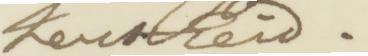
tentheid.
